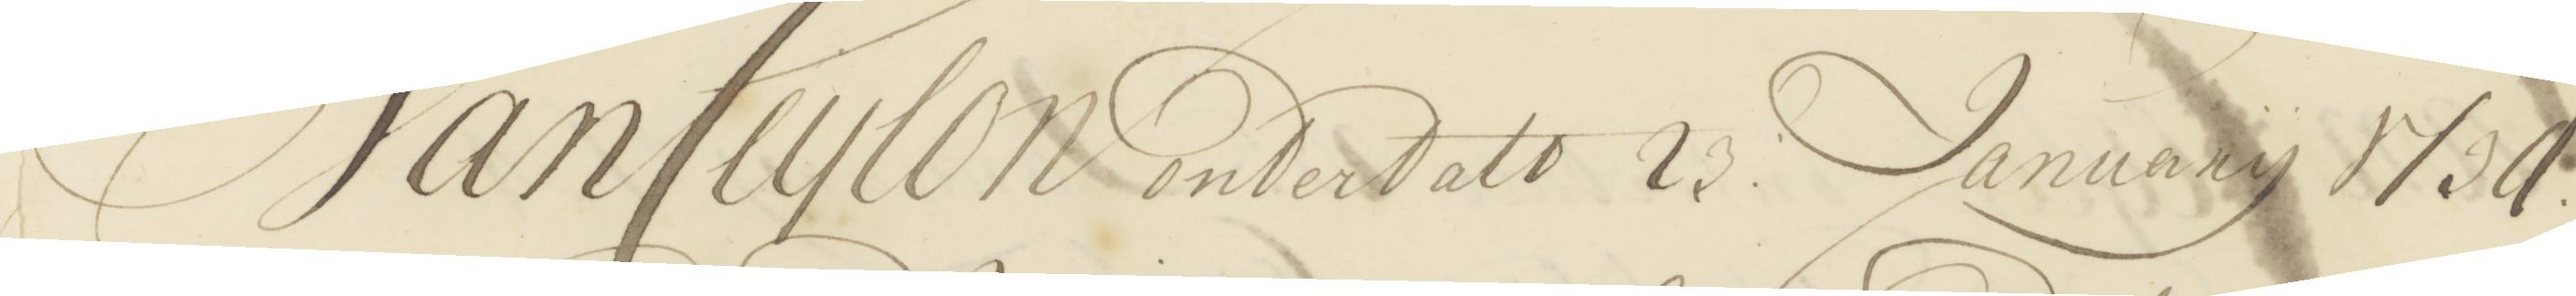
Van Ceijlon onderdato 23: Ianuarij 1734.
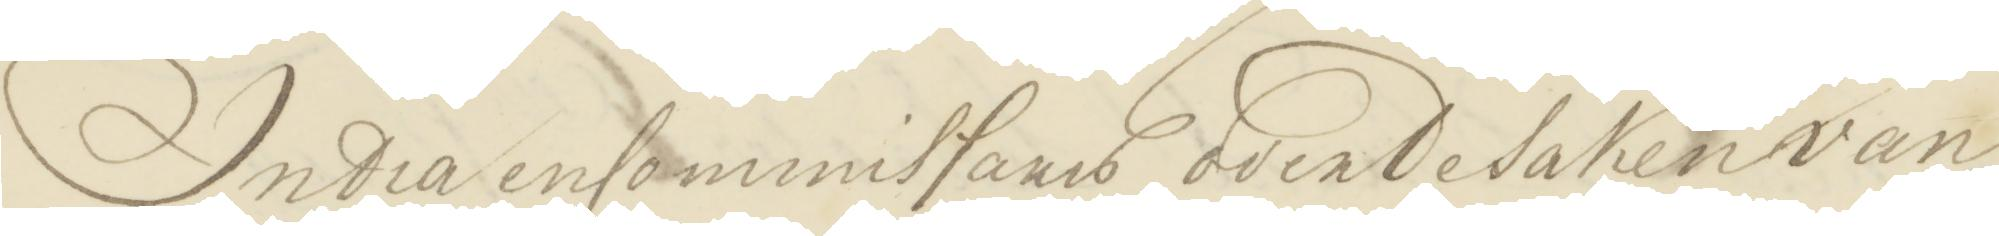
India en Commissaris over de Saken van
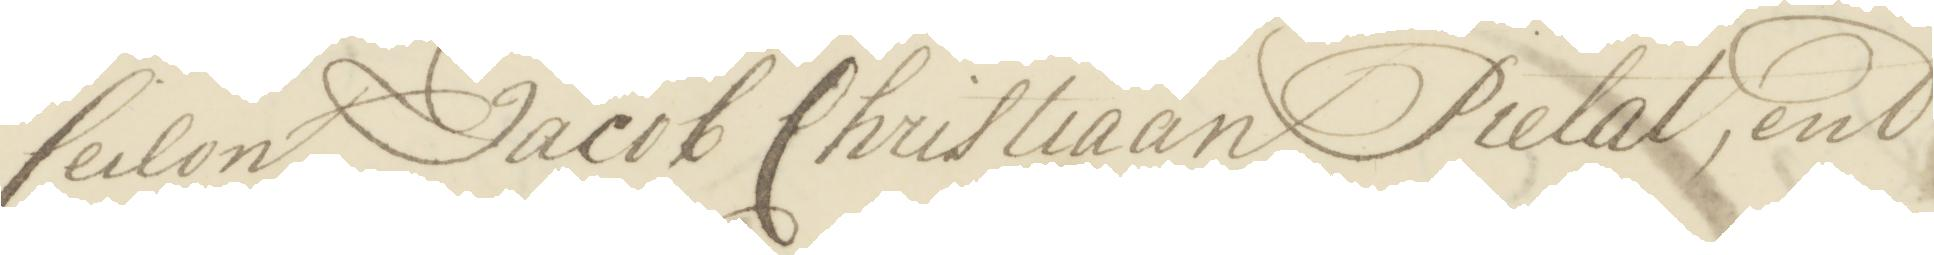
Ceilon Iacob Christiaan Pielat, end
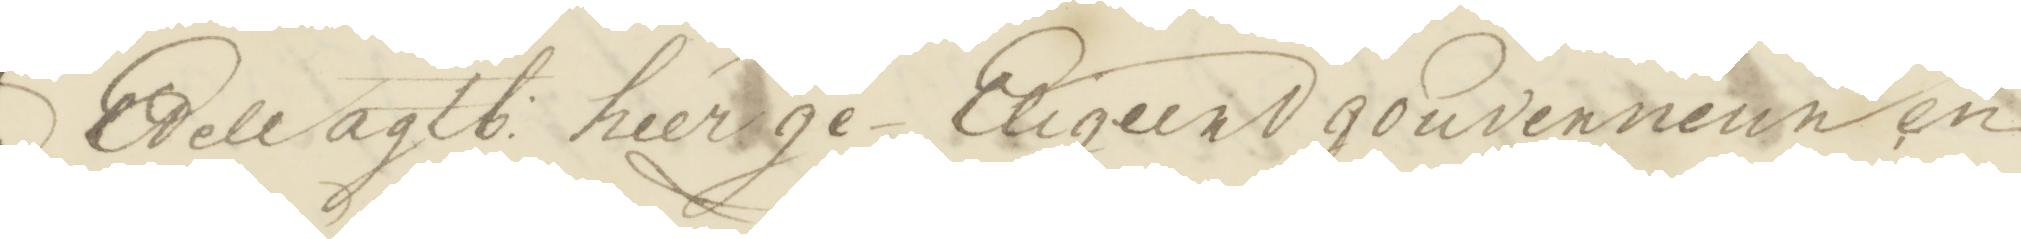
Edele agtb: heer ge-Eligeerd gouverneur en
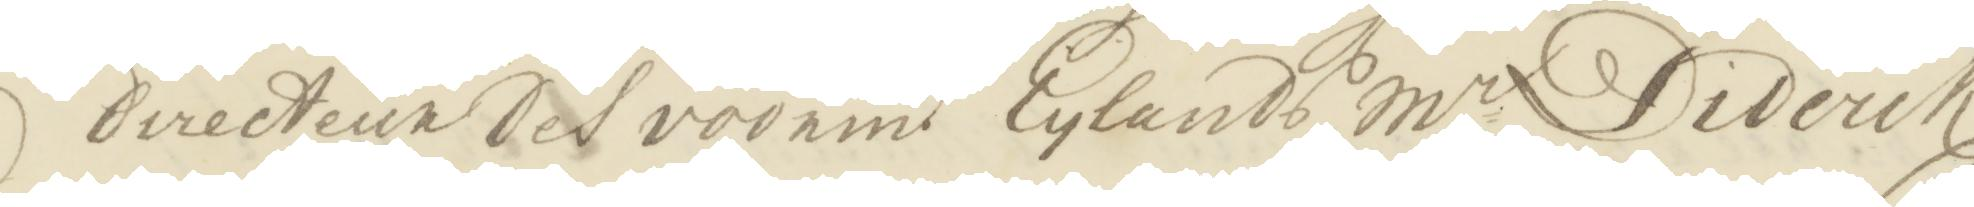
directeur des voorm:' Eylands M„r Diderik
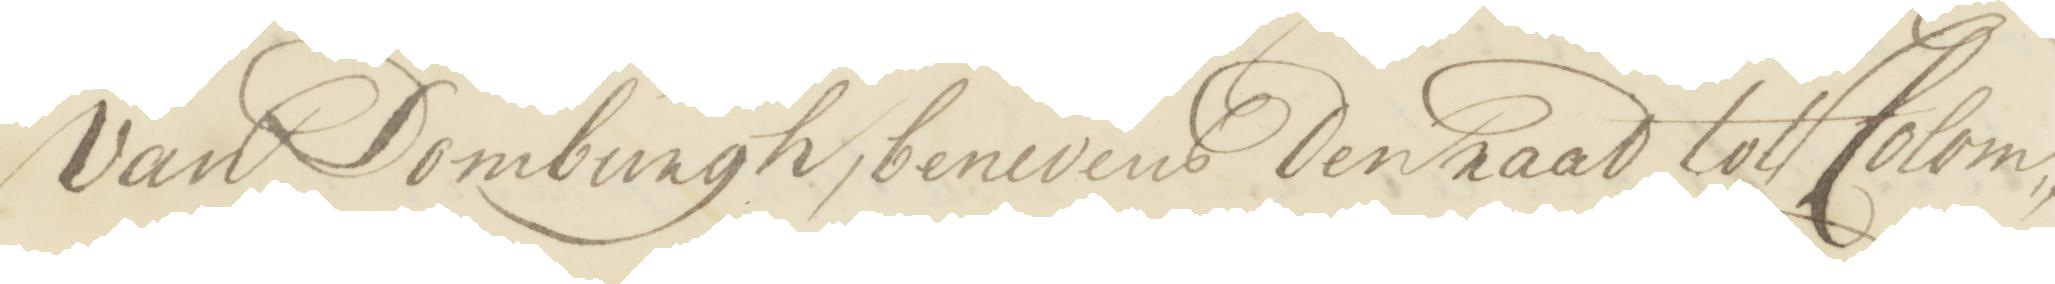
van Domburgh, benevens den raad tot Colom„
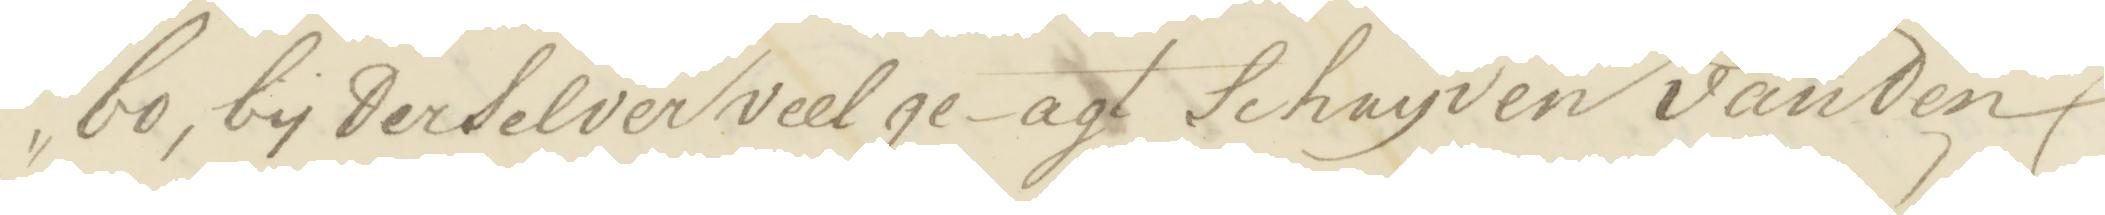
„bo, bij derselver veel ge-agt schrijven van den
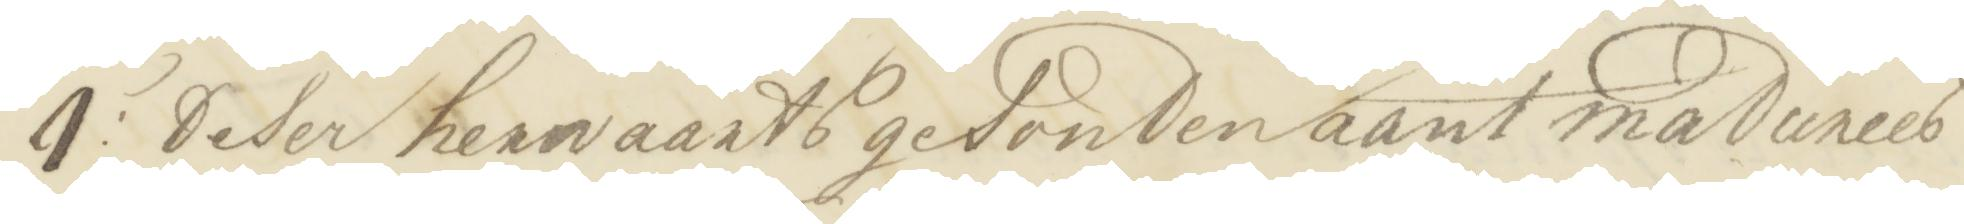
4:' deser herwaarts gesonden aan't madurees
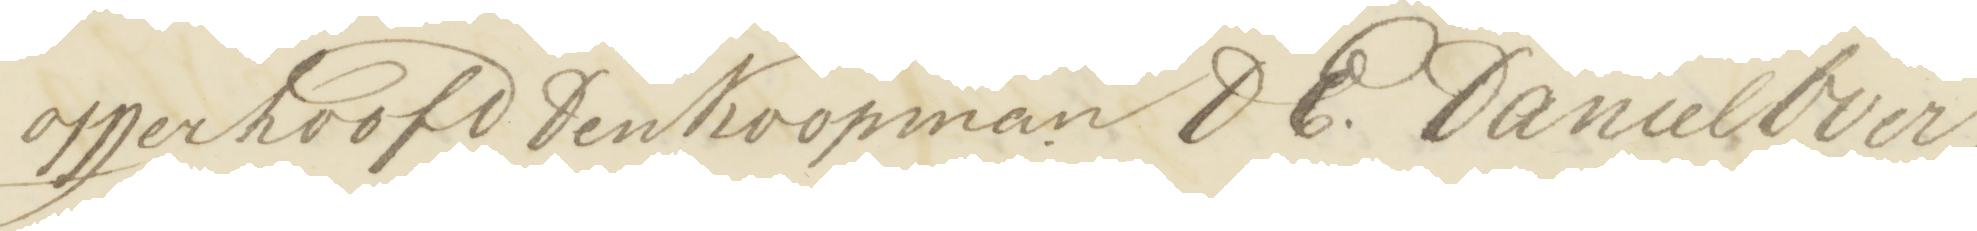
opperhoofd den koopman D E. Daniel Over
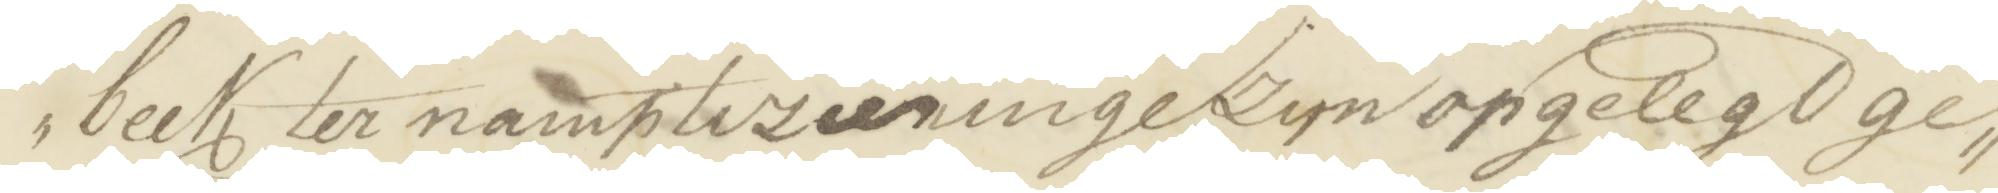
„beek ter namptizieringe zijn opgelegd ge„
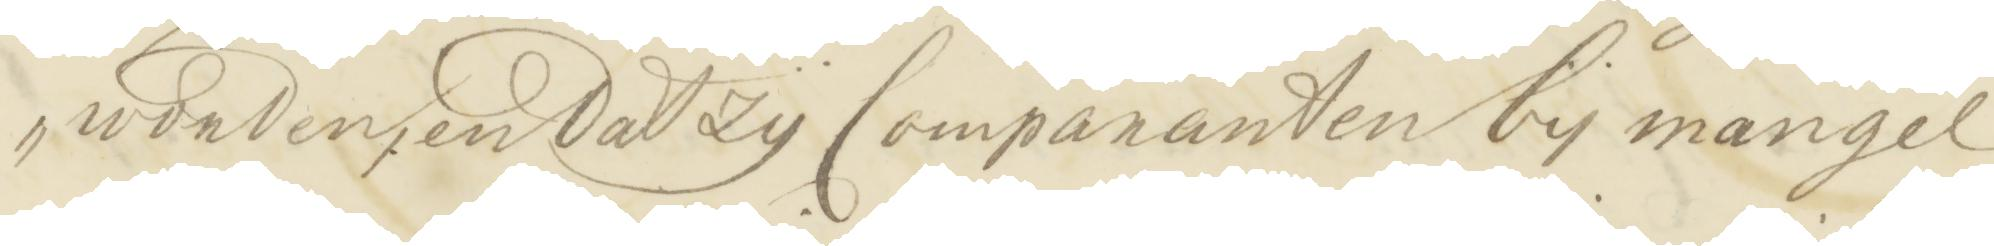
„worden, en dat zij Comparanten by mangel
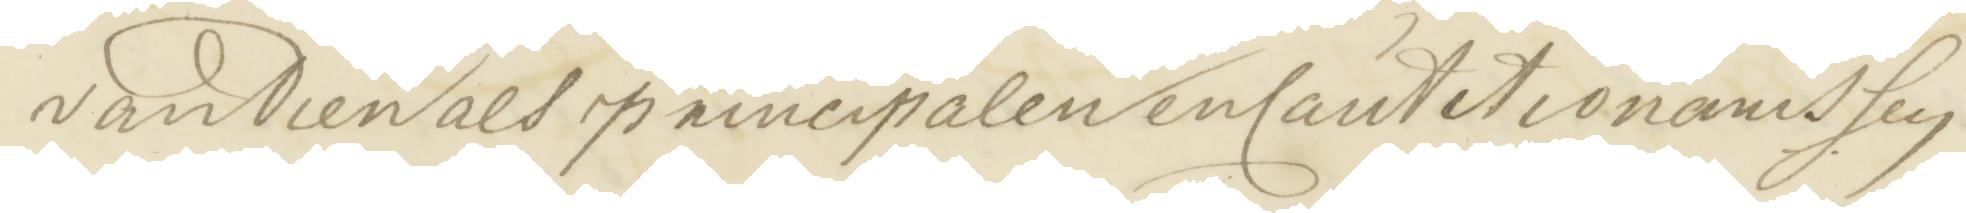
van dien als principalen en Cautitionarissen
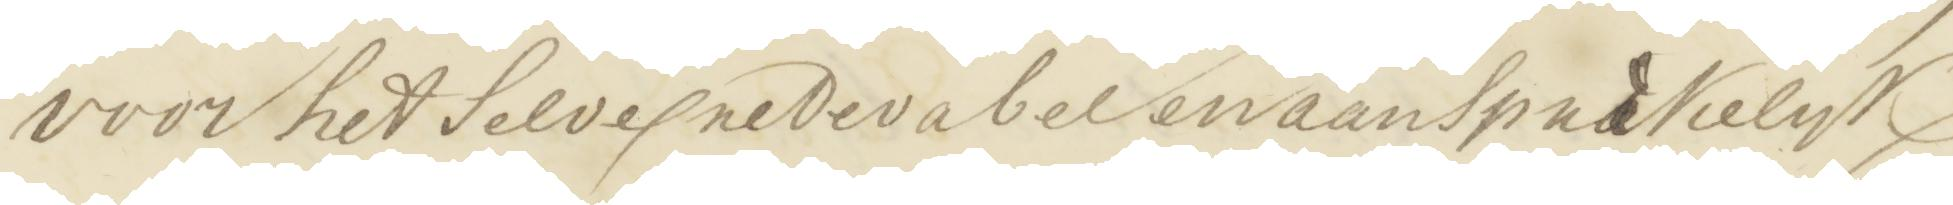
voor het Selve redevabel en aansprakelyk
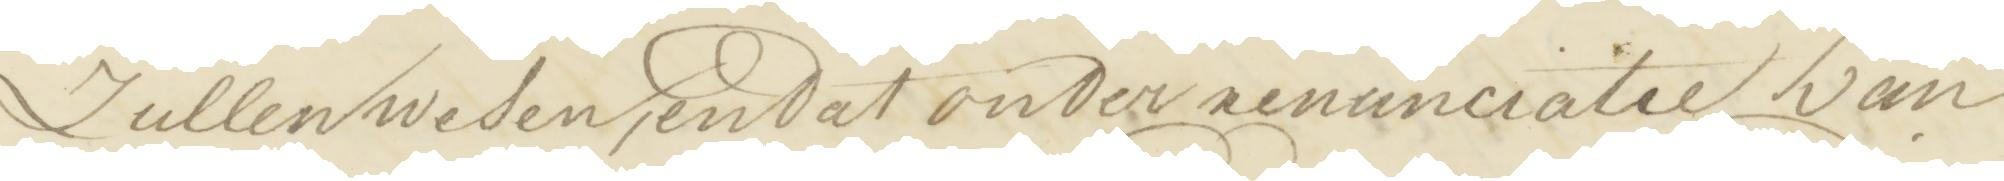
Zullen wesen, en dat onder renunciatie van
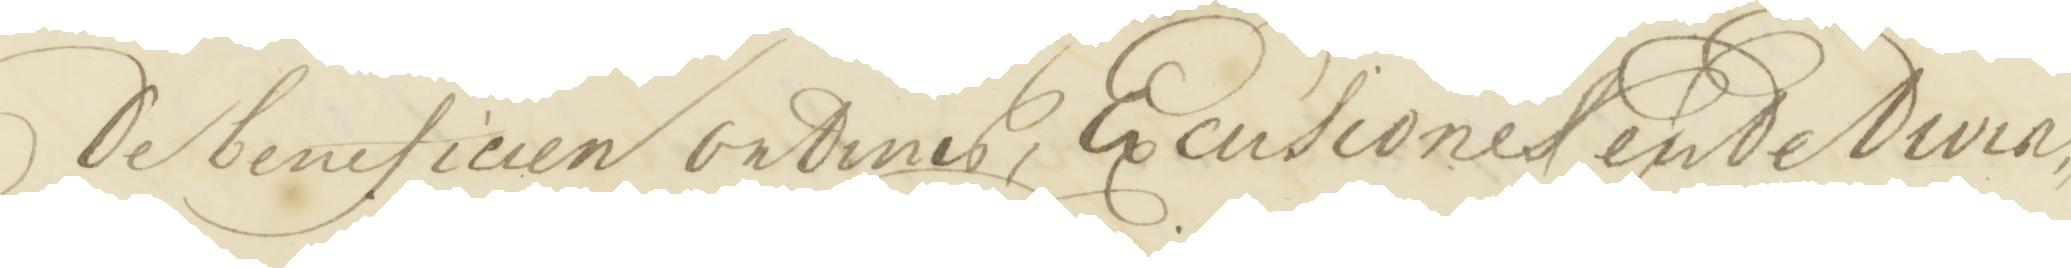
de beneficien ordinis, Excusiones ende divia„
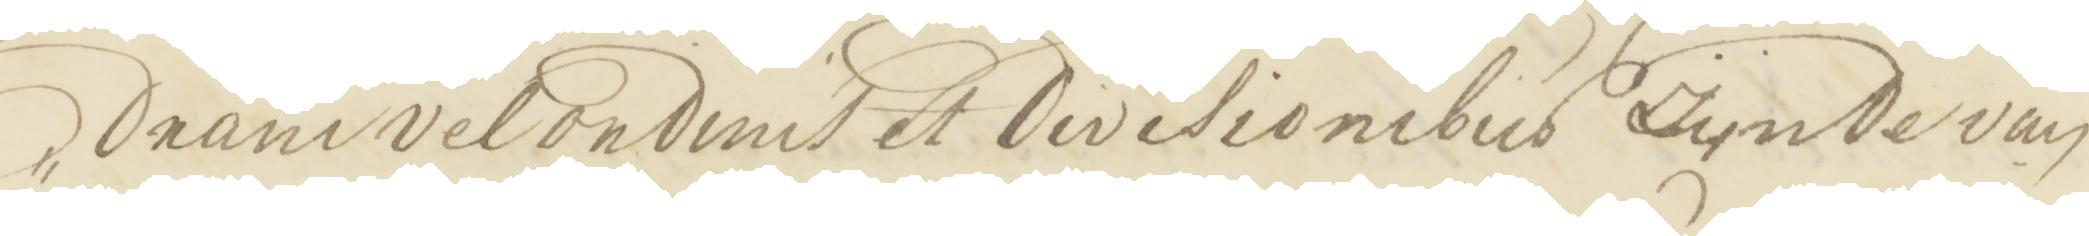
„drani vel ordenis et divisionibus zijnde van
